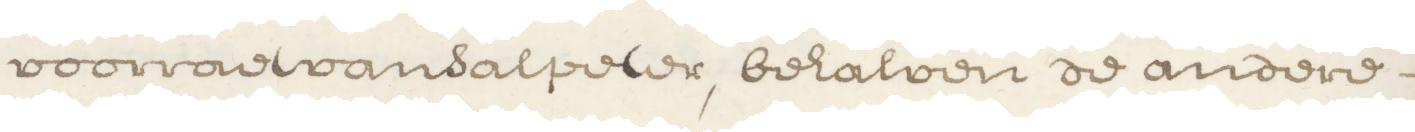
voorraet van salpeter, behalven de andere
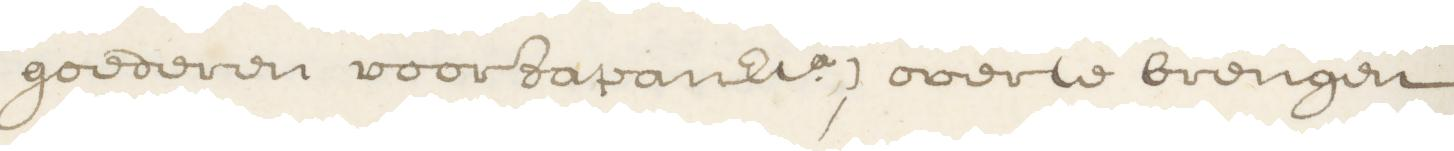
goederen voor japan Et.a; over te brengen
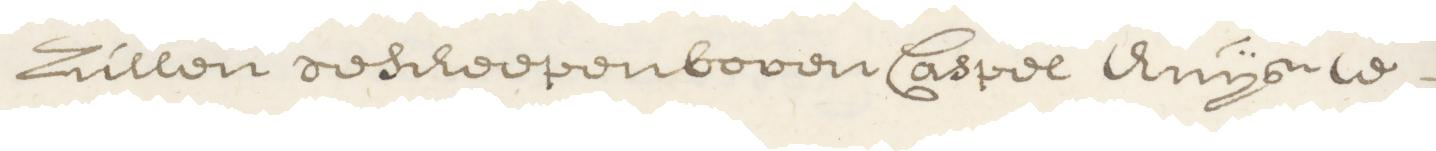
zullen de scheepen boven Caspel Huijsen te
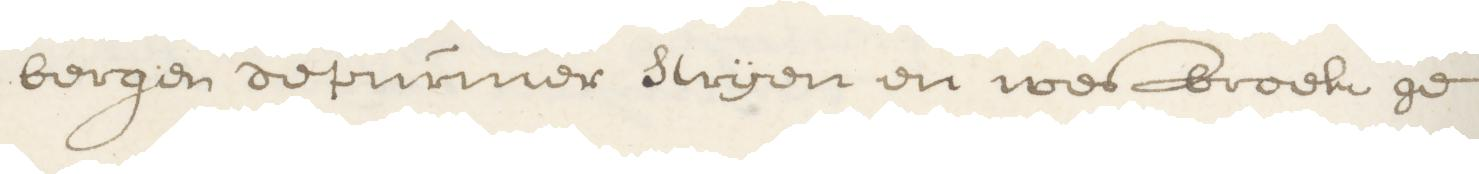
bergen de purmer strijen en westbroek ge
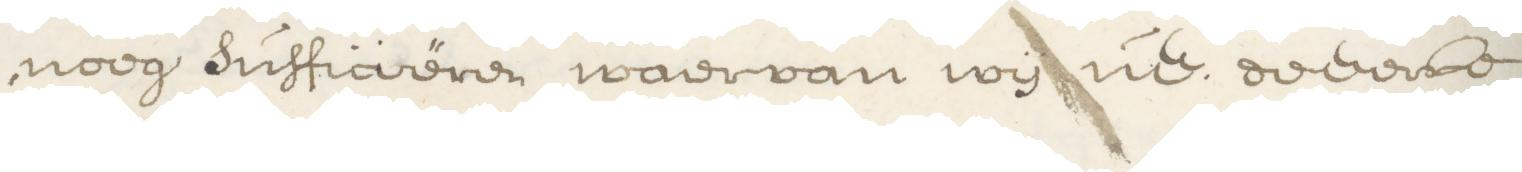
,noeg sufficiëren, waervan wij uE de Eerste
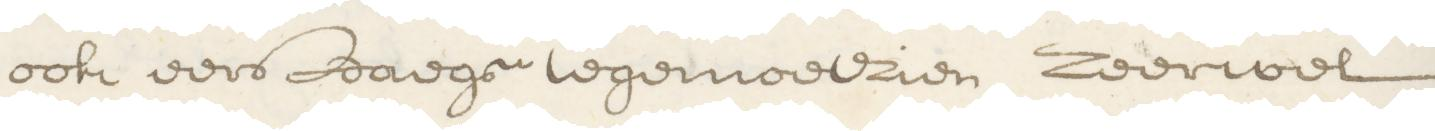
ook eerstdaegs tegemoet zien, zeer wel
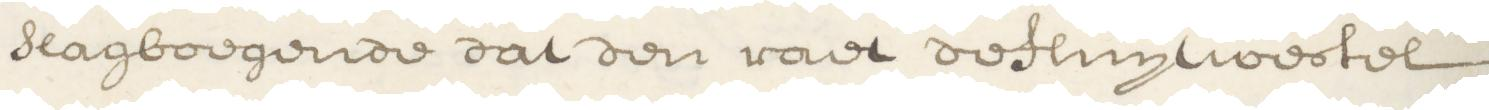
slagboegende dat den raet de fluijt westel
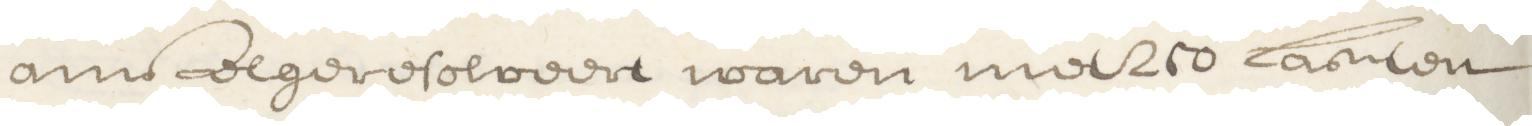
amstelgeresolveert waren met 250 Lasten
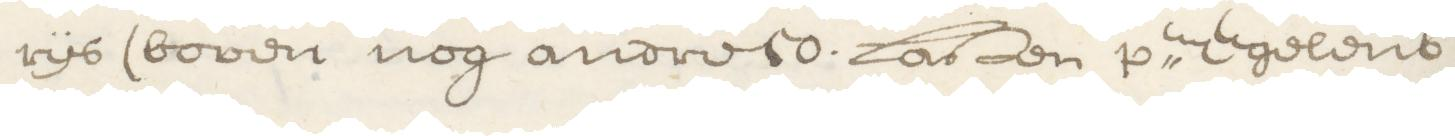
rijs (boven nog andre 50. Lasten p=m Egelenb.
